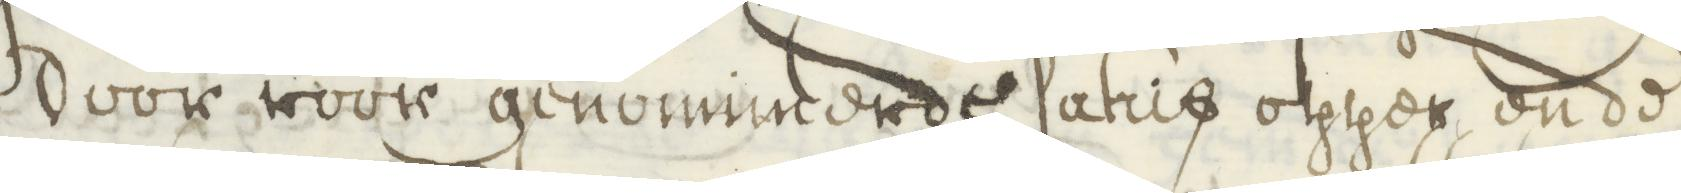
door voor genomineerde sakis opper en de
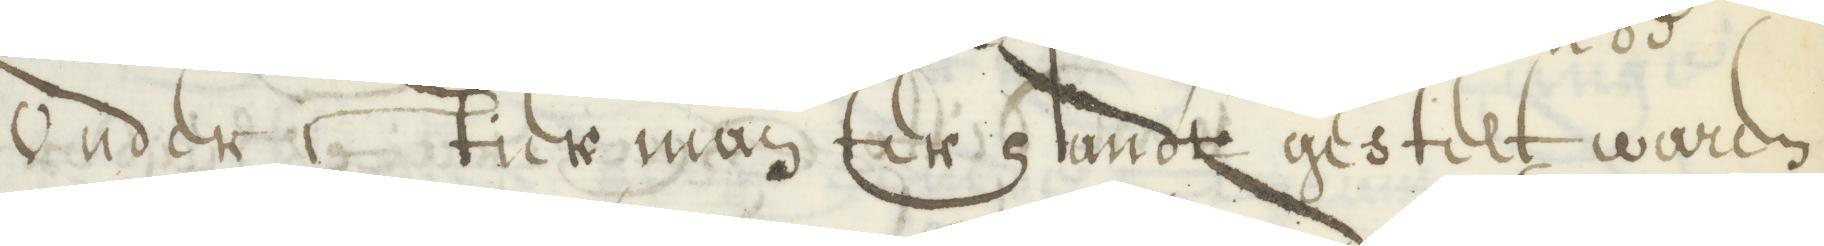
onder stierman ter handt gestelt waren
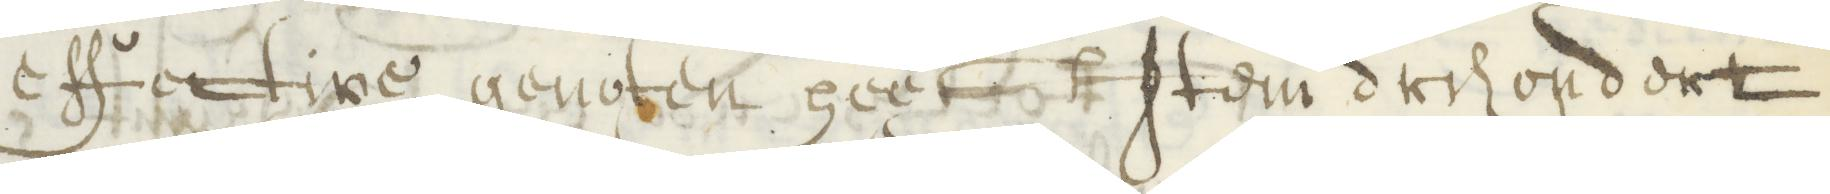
effective genoten heeft jtem drihondert
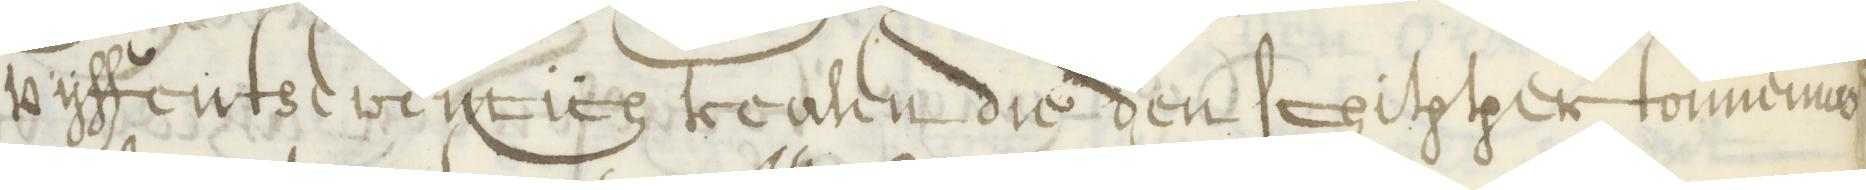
vijffentseventich realen die den schipper tonnemes
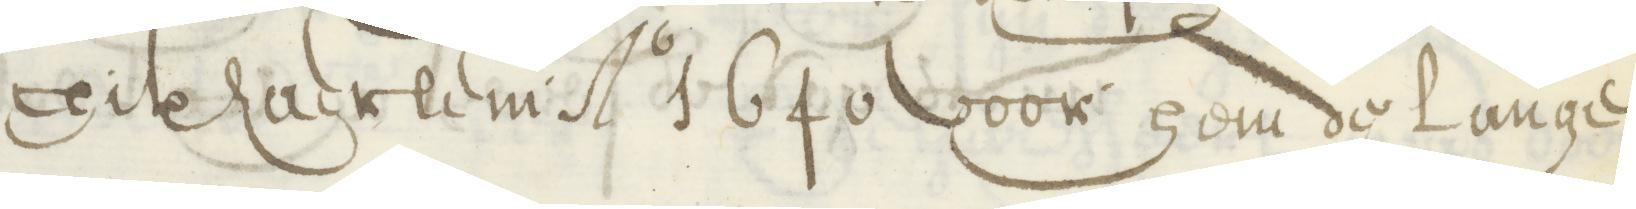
pr schip haerlem Ao 1640 voor hem de Lange
